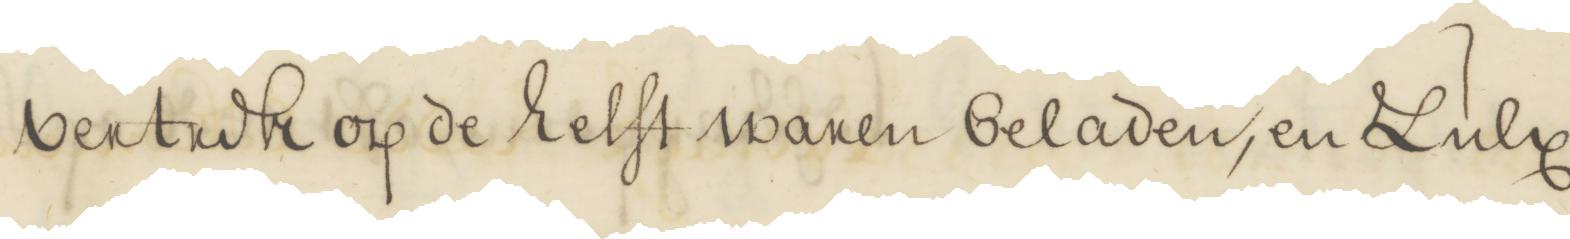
vertrek op de helft waren beladen, en zulx
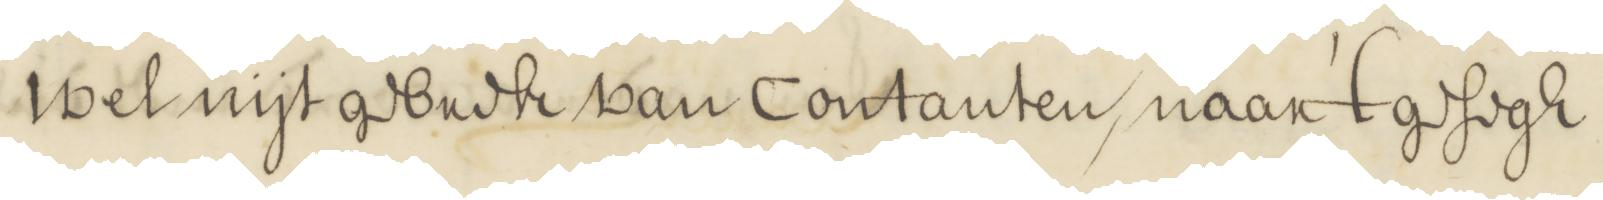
wel uijt gebrek van contanten, naar ’t gesegh
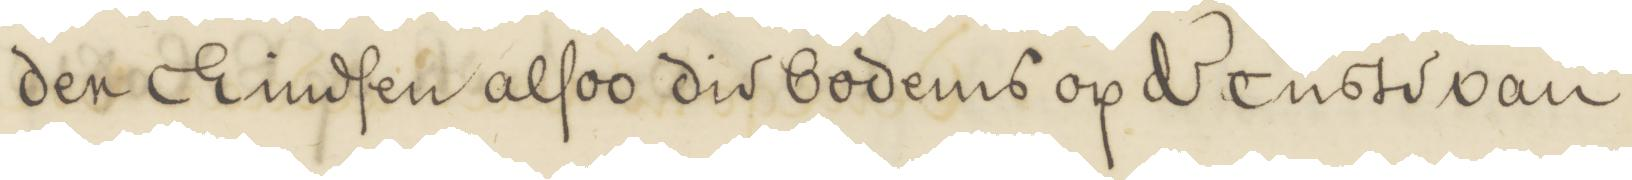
der Chinesen alsoo die bodems op de custe van
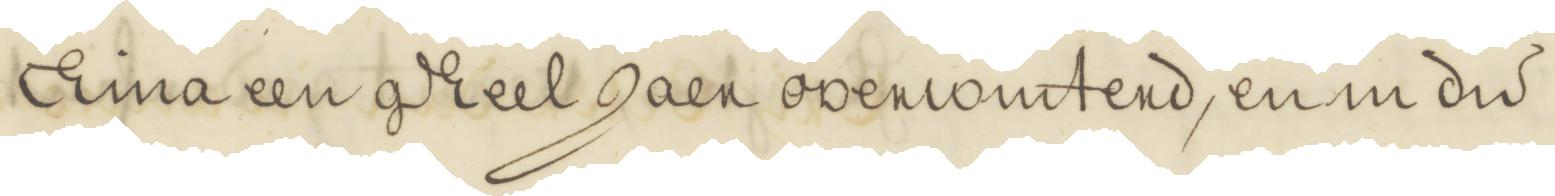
China een geheel jaer overwinterd, en in die
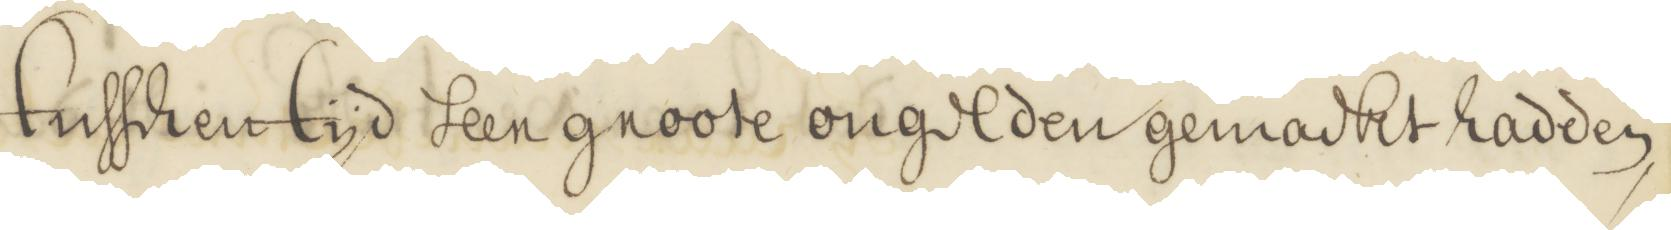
tusschen tijd seer groote ongelden gemaekt hadden,
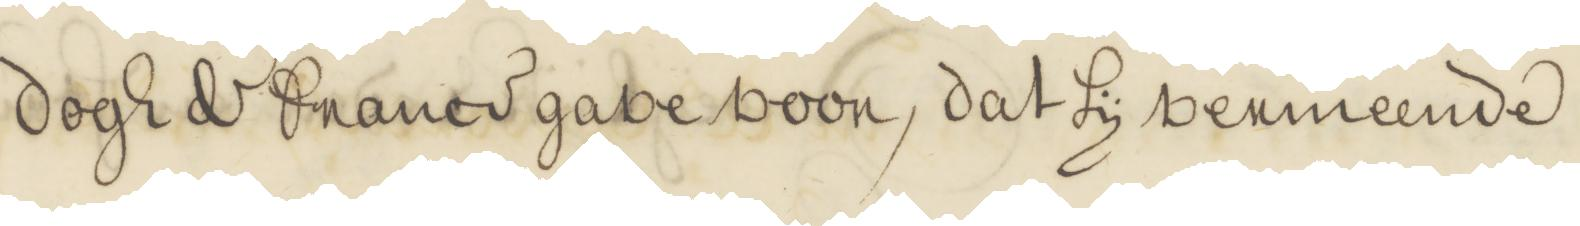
dogh de france gave voor, dat sij vermeende
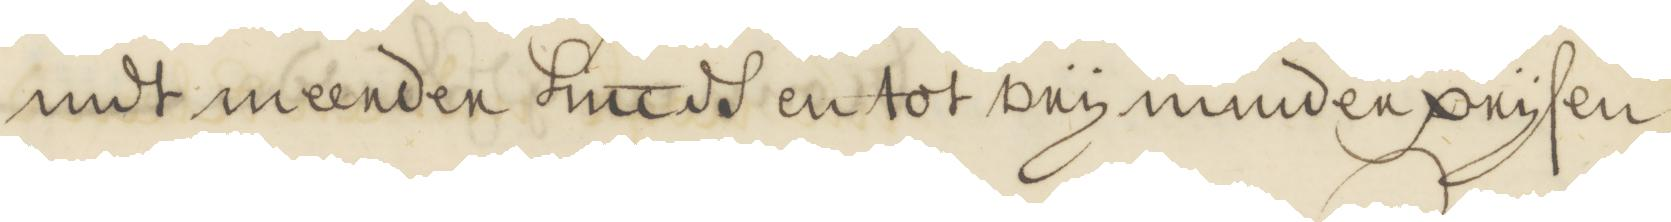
met meerder succes en tot vrij minder prijsen
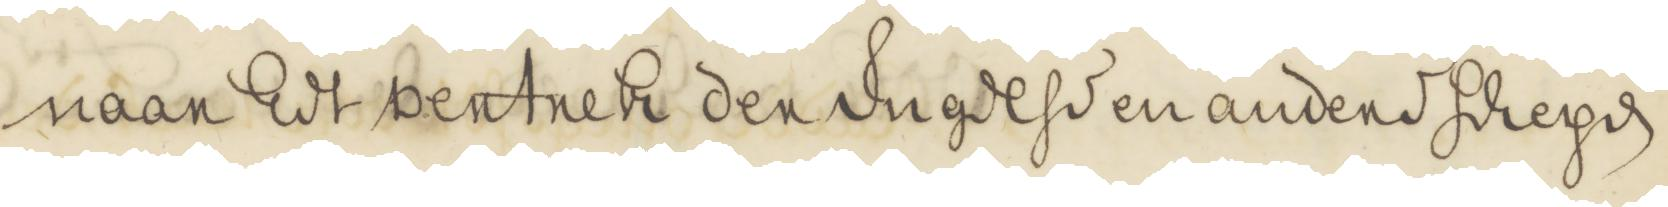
naar het vertrek der Engelse en andere schepen
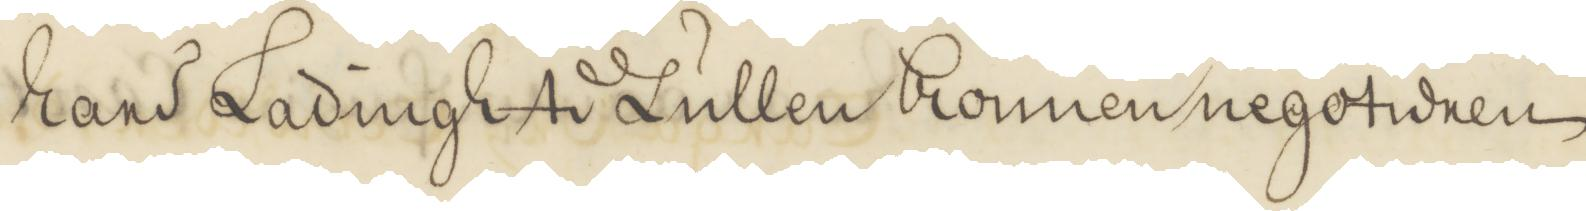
hare Ladingh te zullen konnen negotieren
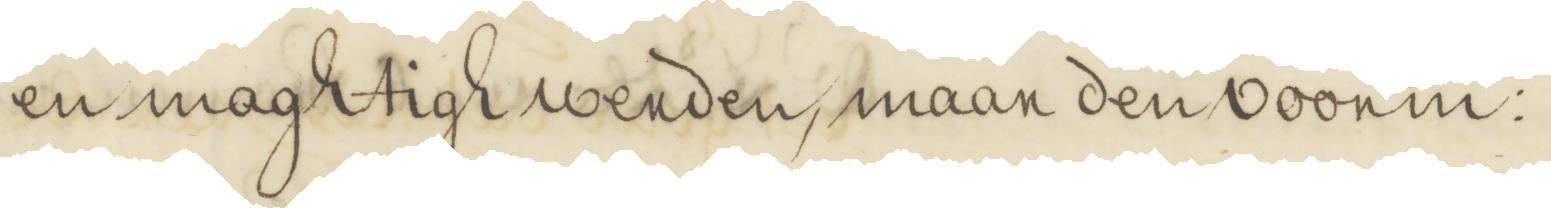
en maghtigh werden, maar den voorm:
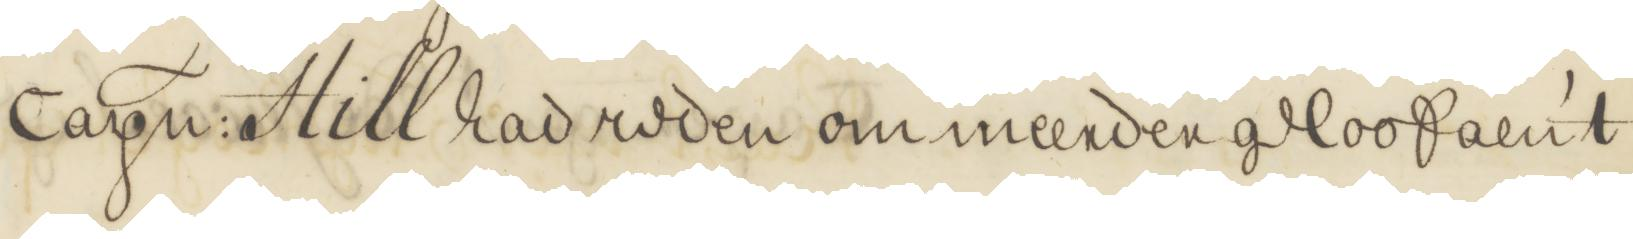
Capn: Hill had reden om meerder geloof aen 't
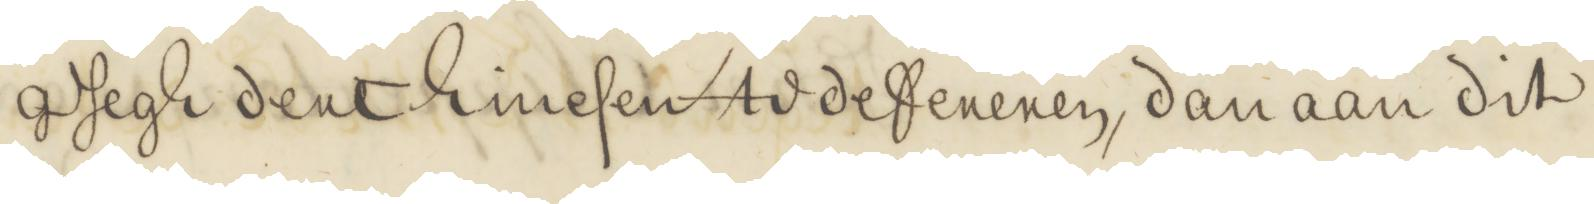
gesegh der Chinesen te defereren, dan aan dit
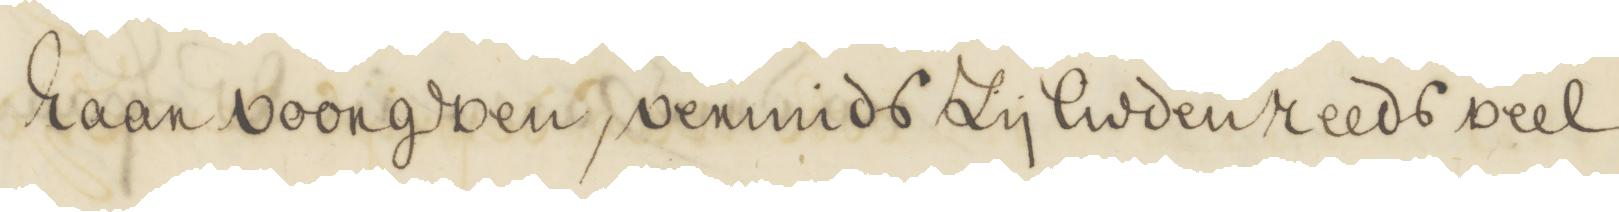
haar voorgeven, vermids zij lieden reeds veel
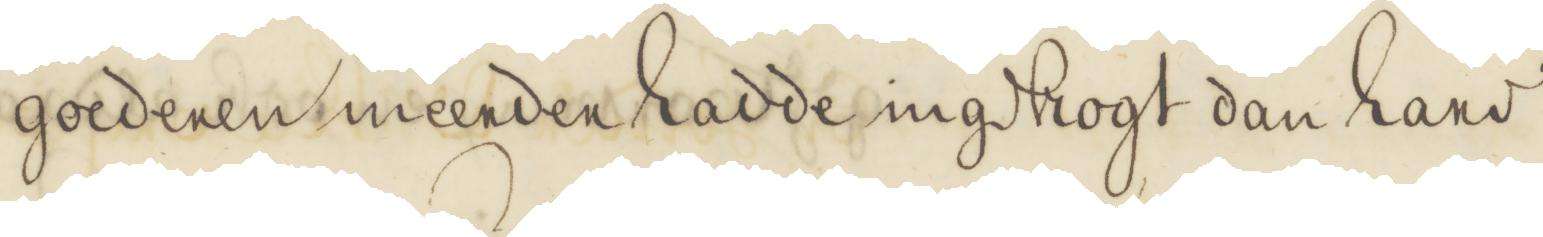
goederen meerder hadde ingekogt dan hare
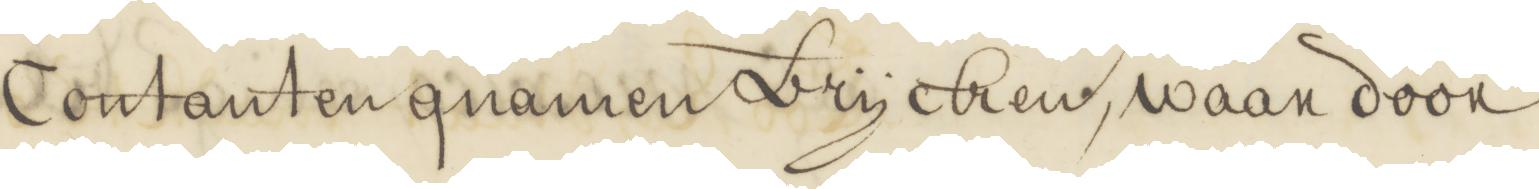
Contanten quamen te rijcken waar door
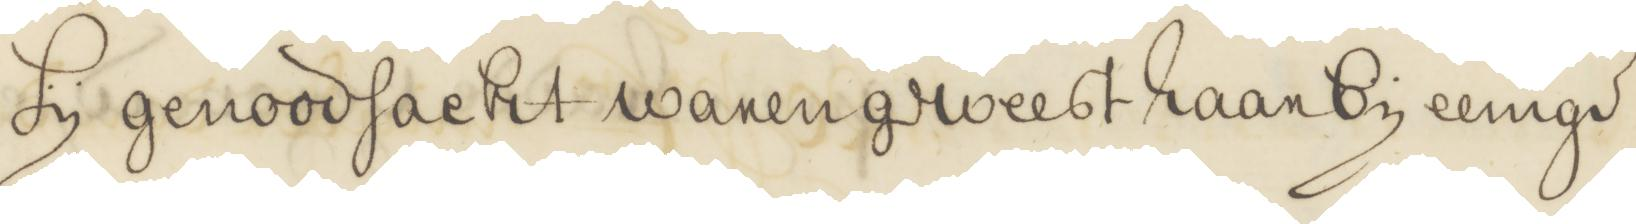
sij genoodsaekt waren geweest haar bij eenige
